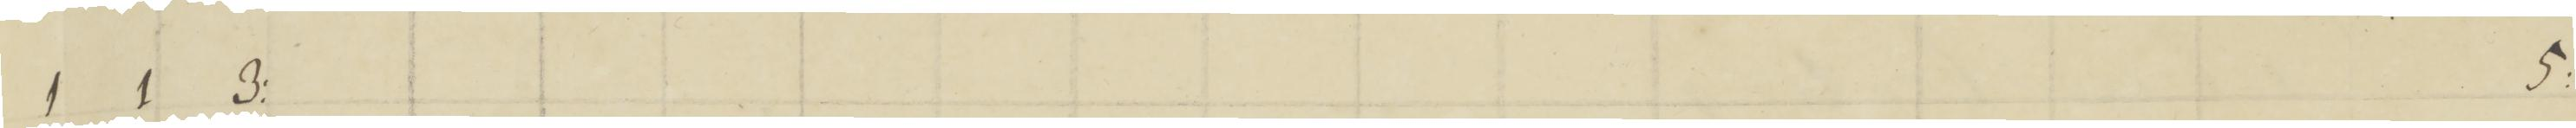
1 1 3: 5:
